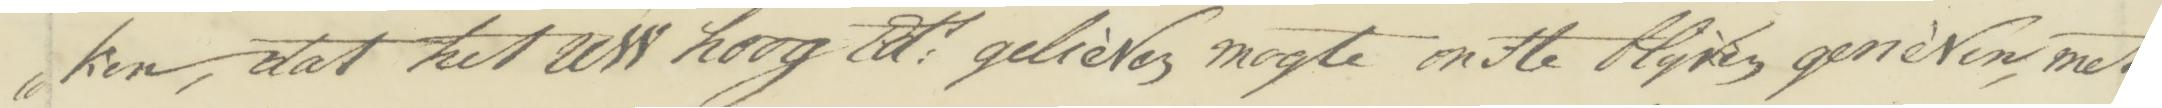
„ken, dat het uw hoog Ed:s gelieven mogte onste blijven gerieven, met
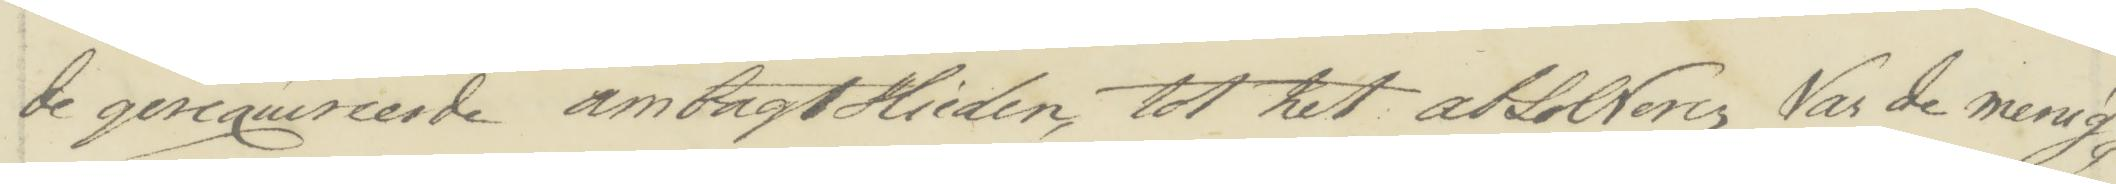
de gerequireerde ambagtslieden, tot het absolveren van de menig=
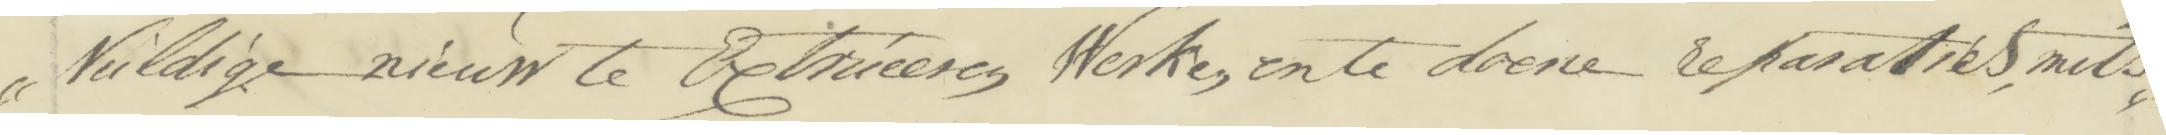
„ vuldige nieuw te Extrueeren werken en te doene reparaties, mits„
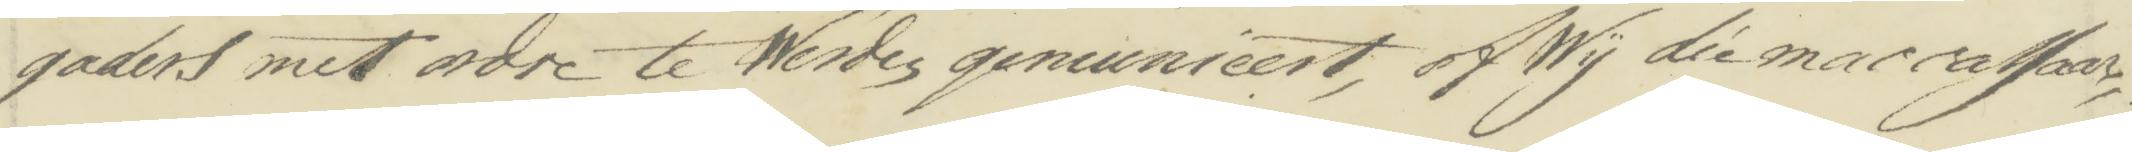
gaders met ordre te werden genunieert, of wij die maccassaar,
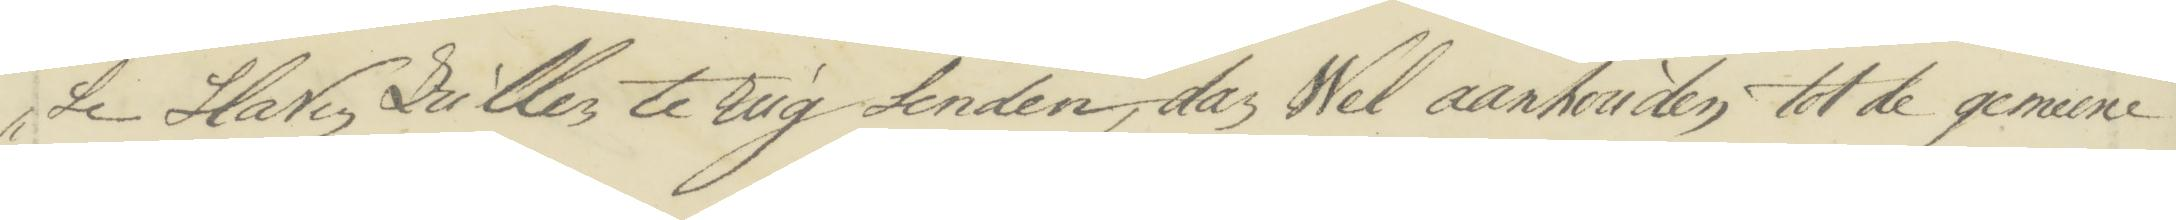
„se slaven zullen te rug senden, dan wel aanhouden tot de gemeene
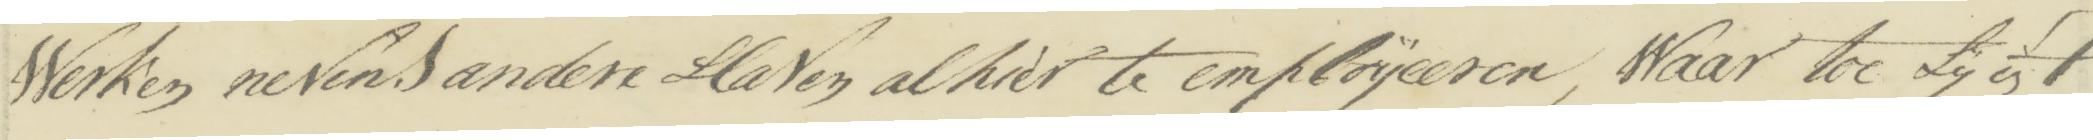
werken nevens andere slaven alhier te emploijeeren, waar toe sij in ’t
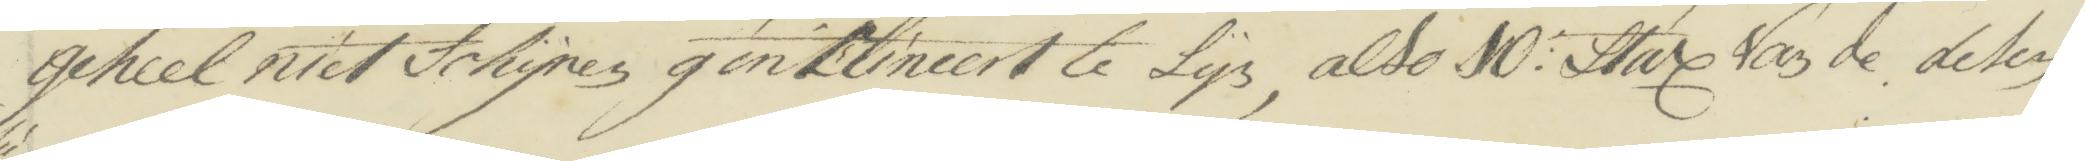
geheel niet schijnen geinclineert te sijn, also 10: stux van de desen
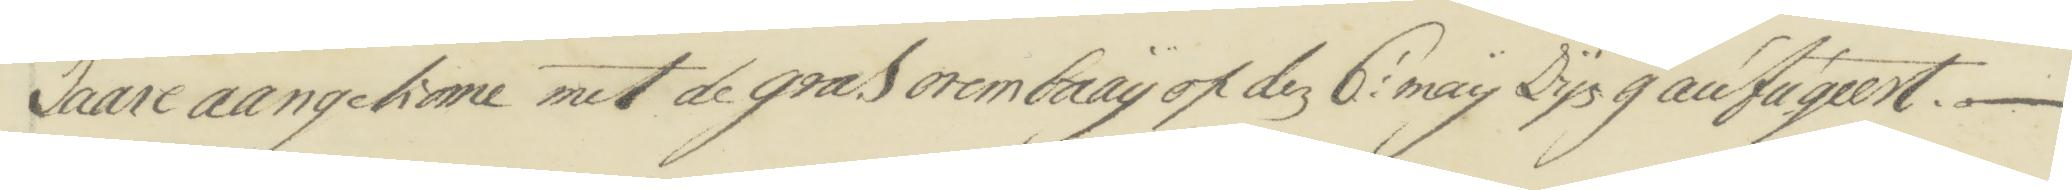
Iaare aangekome met de gras orembaaij op den 6:' maij zijn g’aufugeert. —
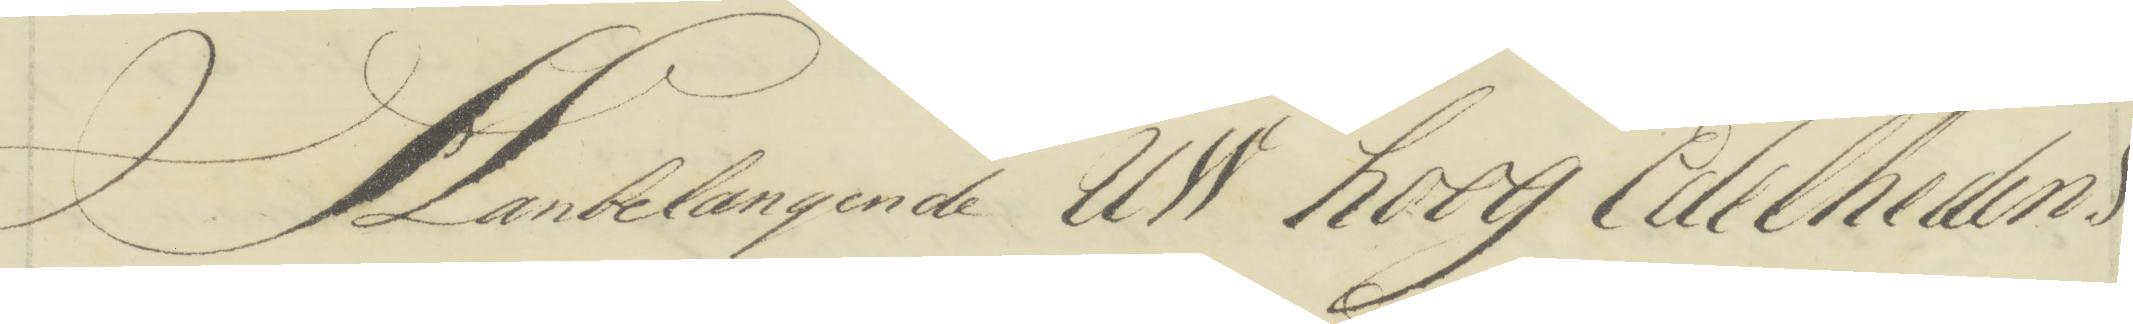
Aanbelangende UW hoog Edelhedens
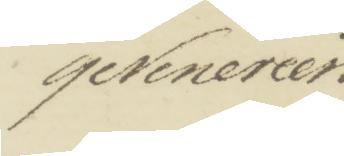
gevenereerde
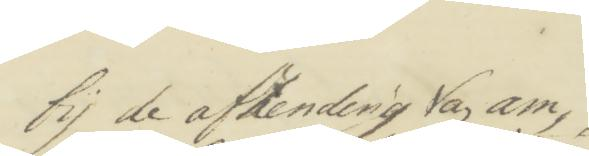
bij de afzending van am„
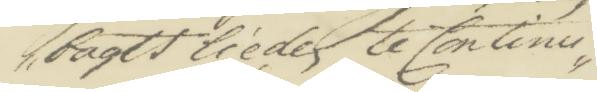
„bagts lieden te Continu„
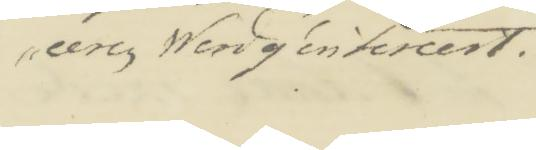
„eeren werd g'insereert.
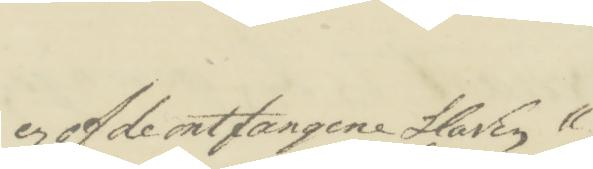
en of de ontfangene slaven „
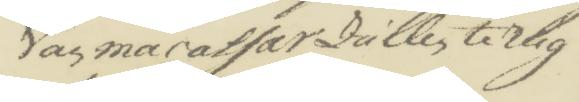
Van macassar zullen terug
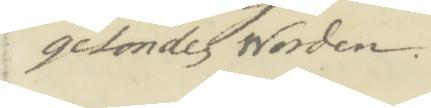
gesonden worden.
